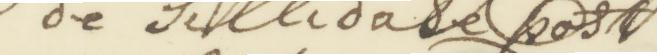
de Silllidase post
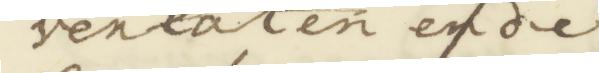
verlaten en de de
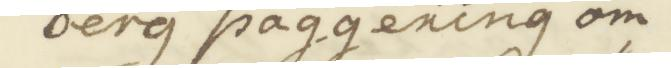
berg paggering om
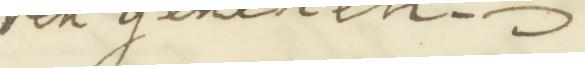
ver gereten.
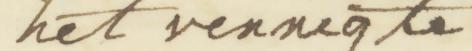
het verrigte
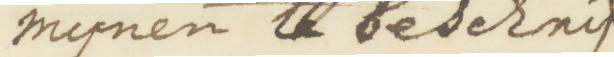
mynen te beschrij
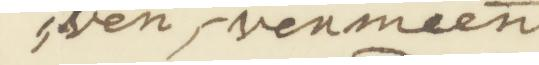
„ven, vermeen
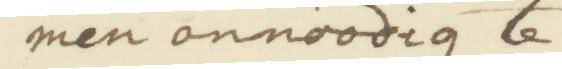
men onnoodig te
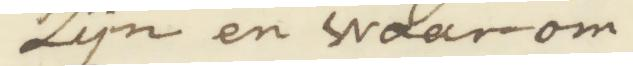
zijn en waarom
